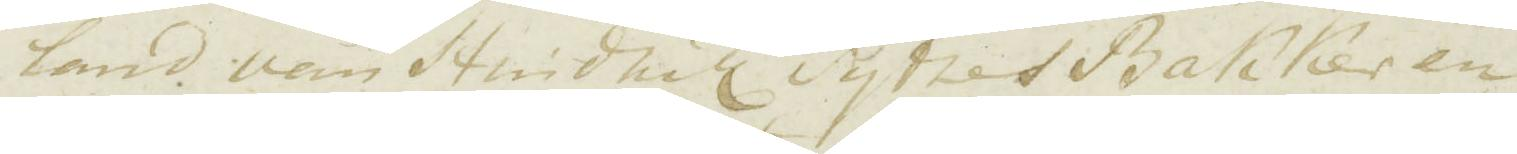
land van Hendrik Sytzes Bakker en
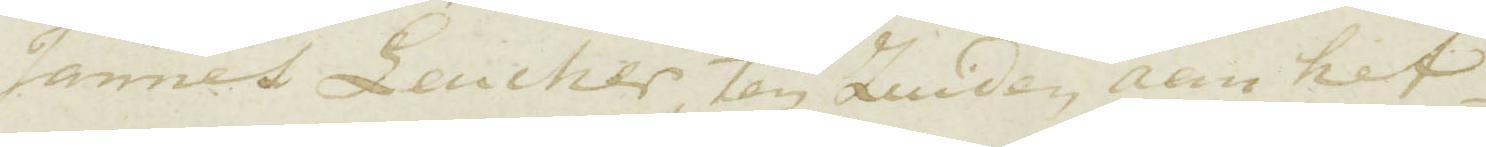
Jannes Leucher, ten zuiden aan het
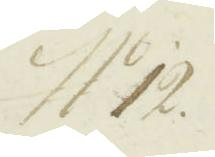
N:o 12.
